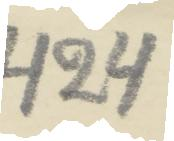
424
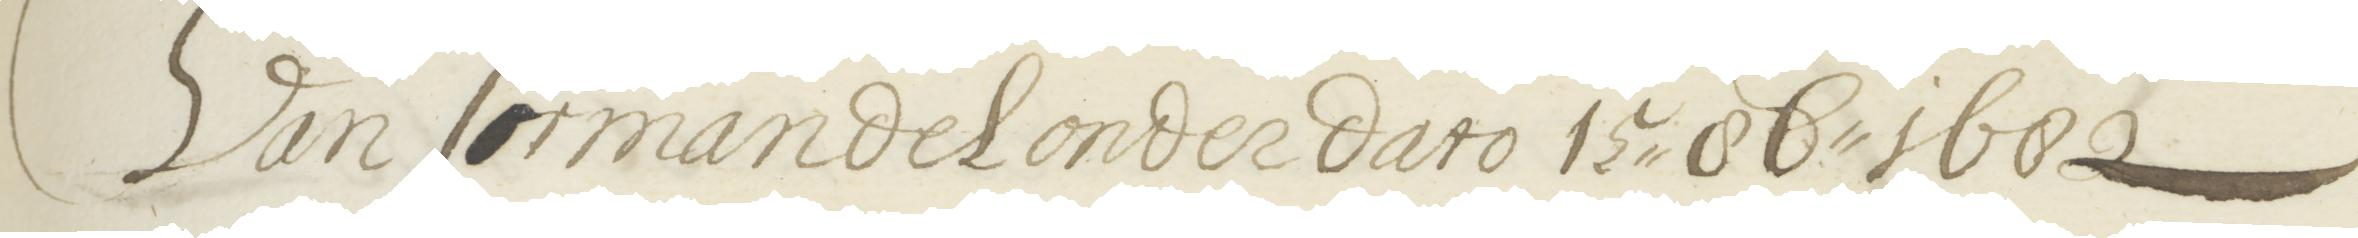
Van Cormandel onder dato 15„' 8b„r 1682
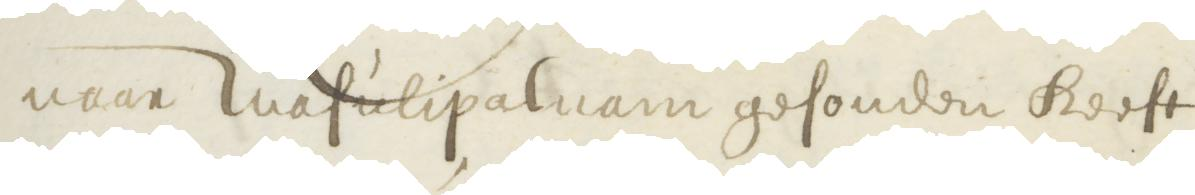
naar masulipatnam gesonden heeft
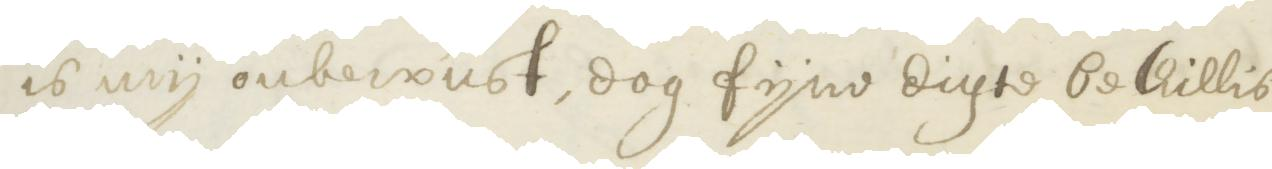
is mij onbewust, dog fijne digte bethillis
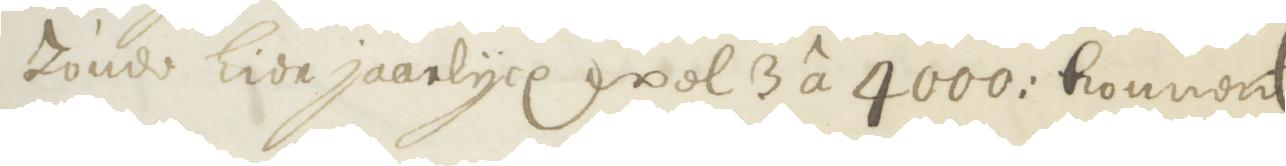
Zoude hier jaarlijcx wel 3 â 4000: konnen
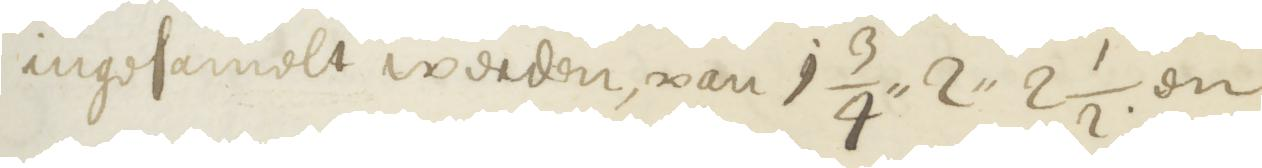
ingesamelt werden, van 1¾„ 2„ 2½ en
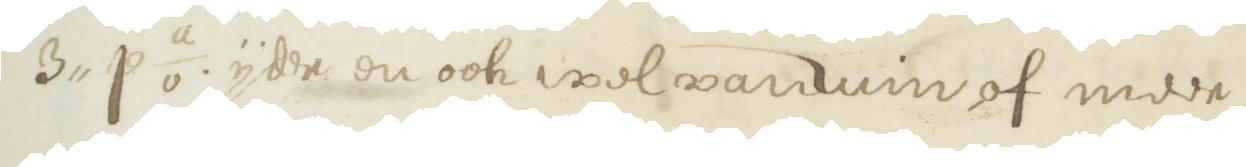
3„ p a/o. ijder en ook wel vandien of meer
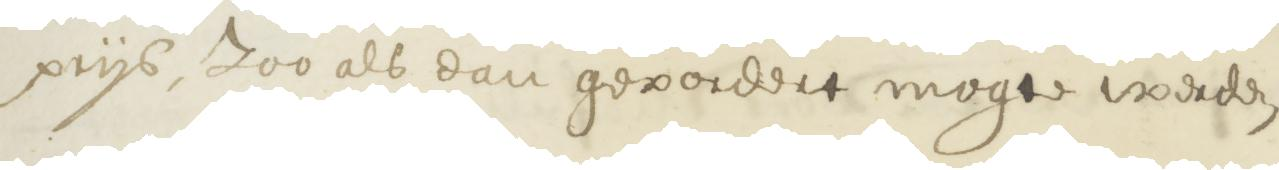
prijs, Zoo als dan gevordert mogte werden
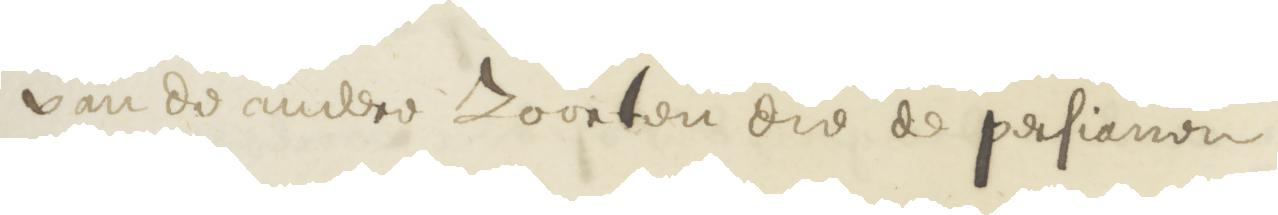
van de andere Zoorten die de persianen
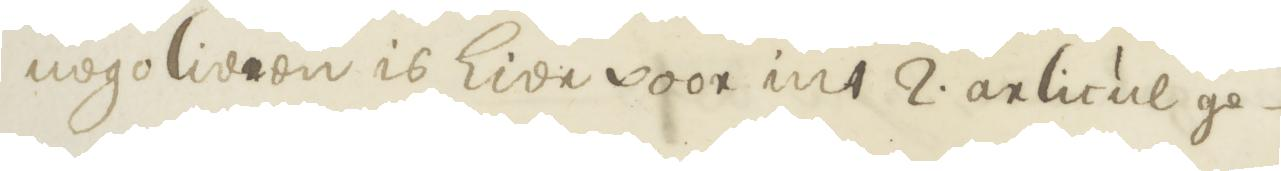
negotieren is hier voor int 2. articul ge
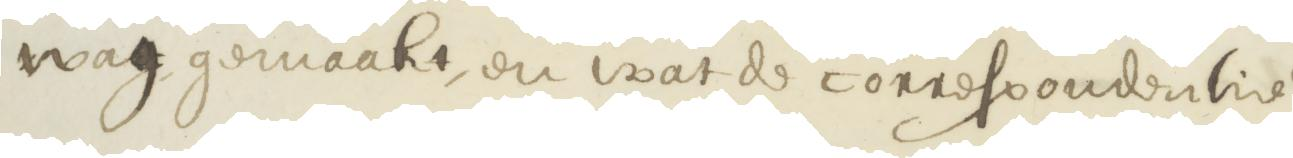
wag gemaakt, en wat de correspondentie
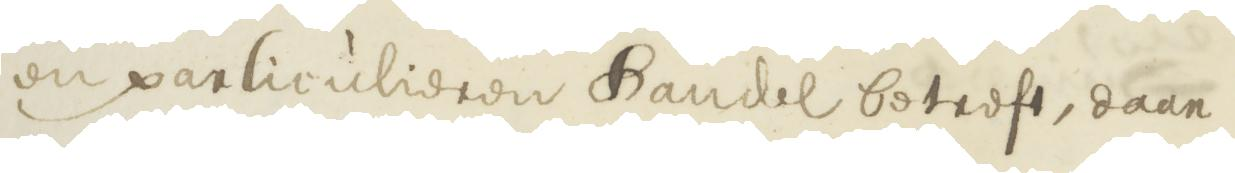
en particulieren handel betreft, daar
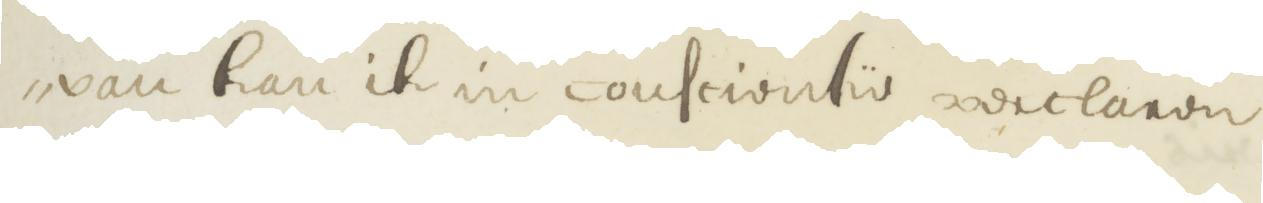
„van kan ik in conscientie verclaren
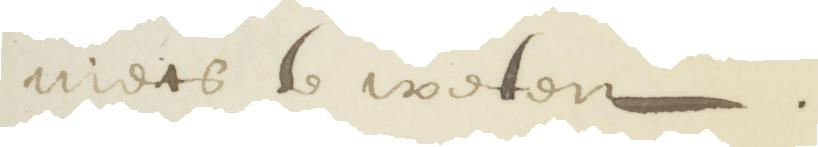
niets te weten.
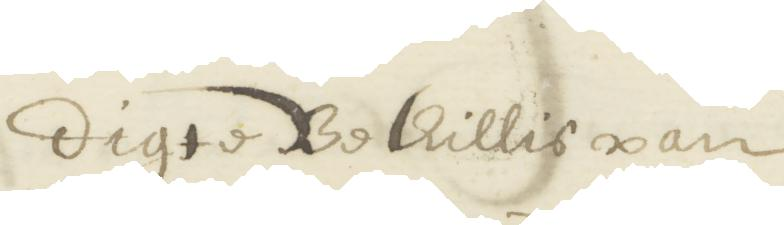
digte Bethillis van
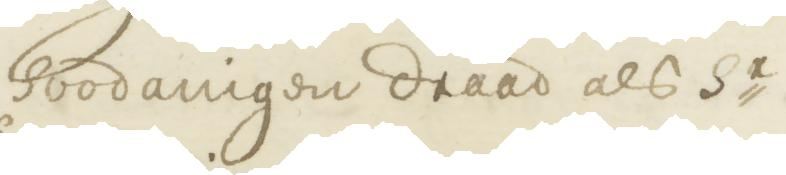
Soodanigen draad als h„r
